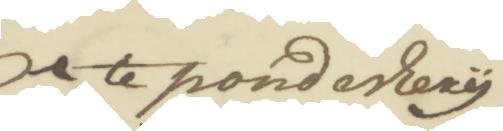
^ te pondecherij
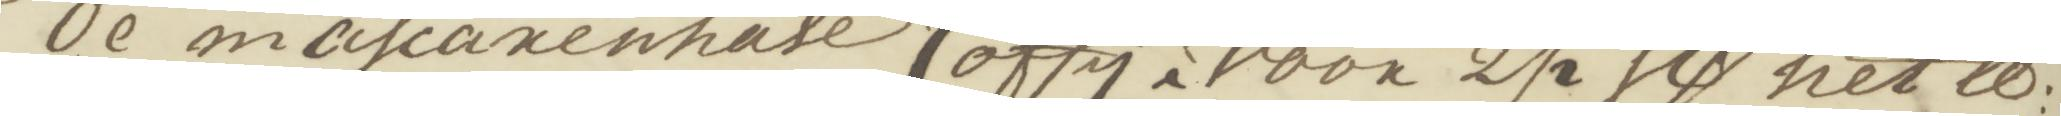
de mascarenhase Coffij ^ voor 2½ stver het lb:
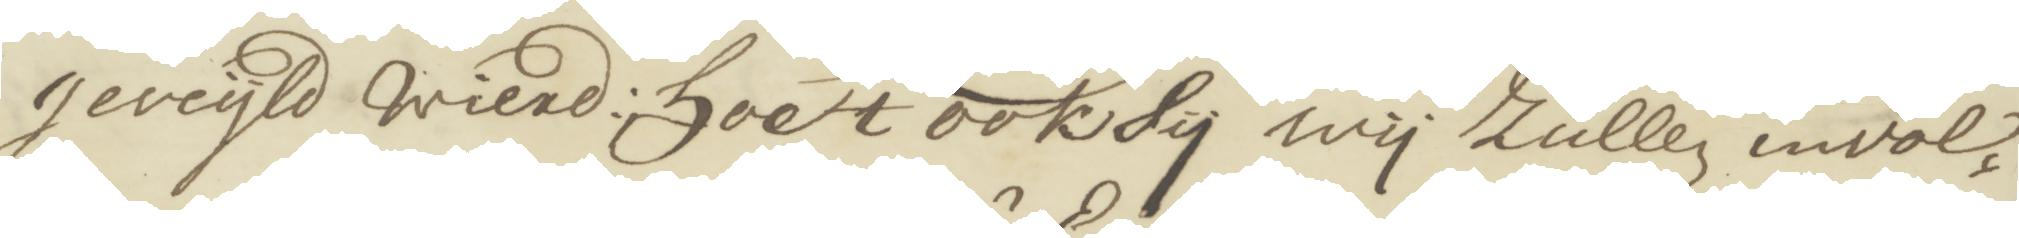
geveijld wierd: hoe 't ook sij wij zullen invol„
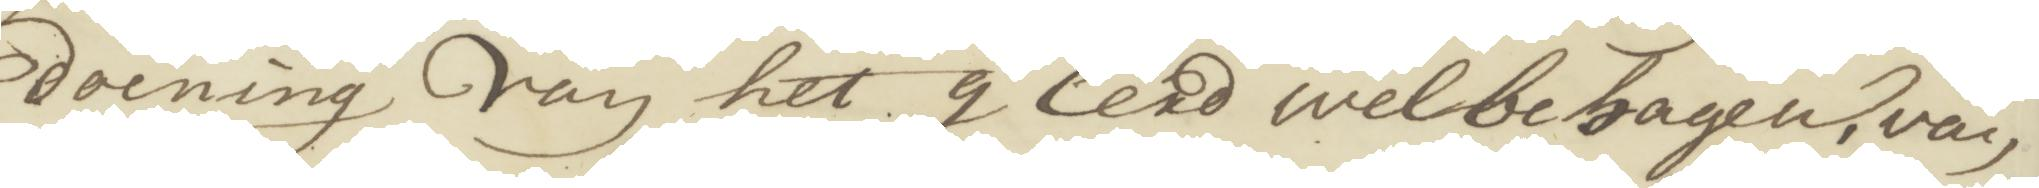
doening van het g' Eerd welbehagen, van
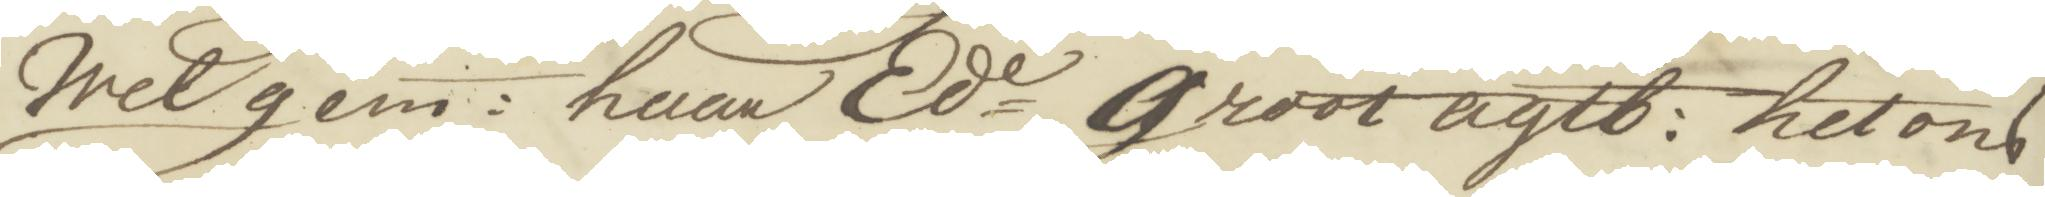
wel gem: haar Ed=e Groot agtb: het ons
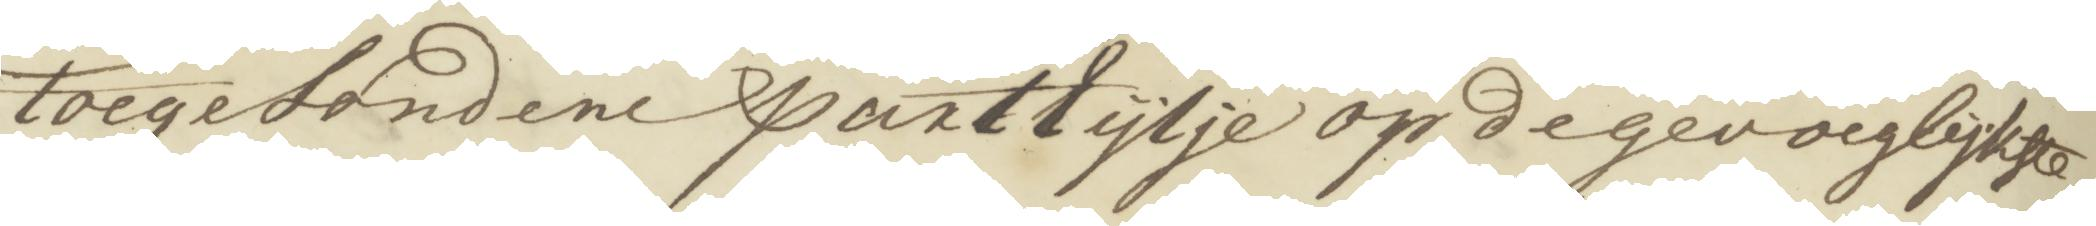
toegesondere parthijtje op de gevoeglijkste
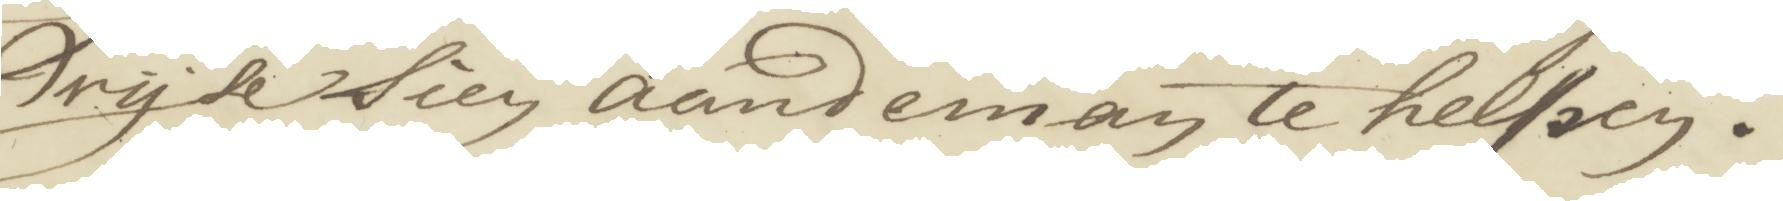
wijse sien aan de man te helpen.
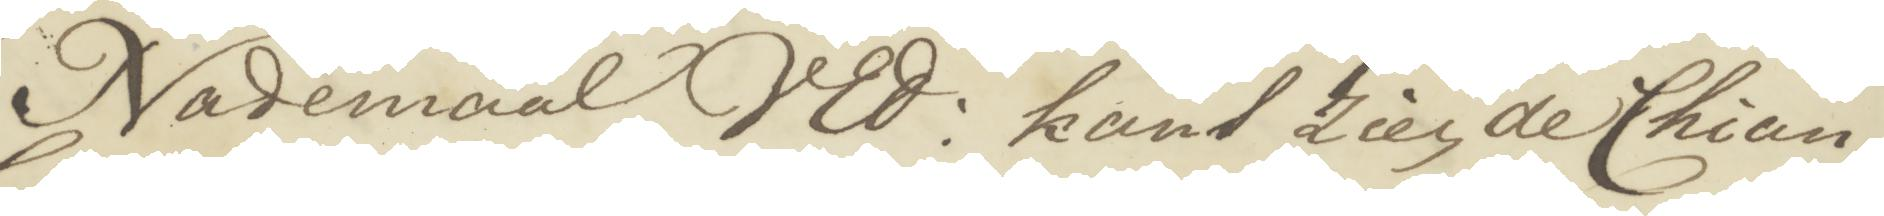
Nademaal VEd: kans zien de Chian
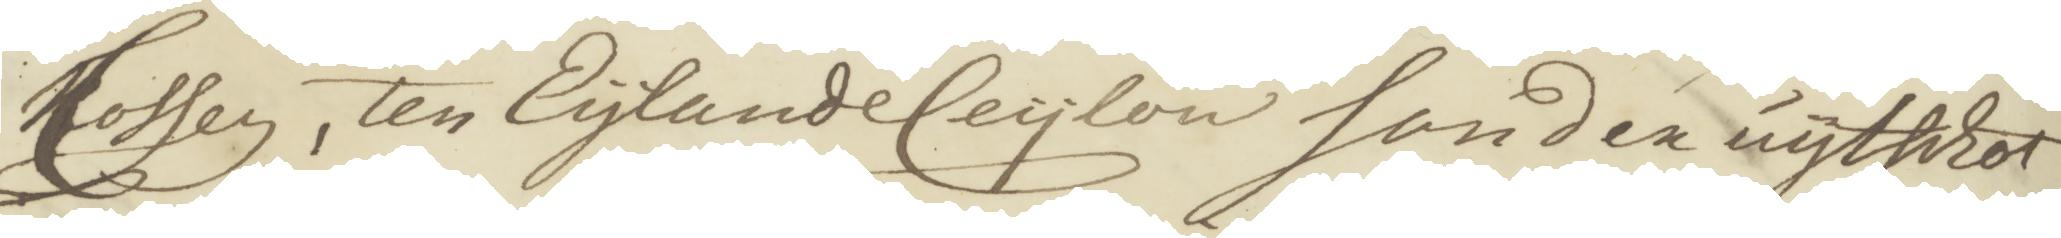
Cossen, ten Eijlande Ceijlon sonder uijtschot
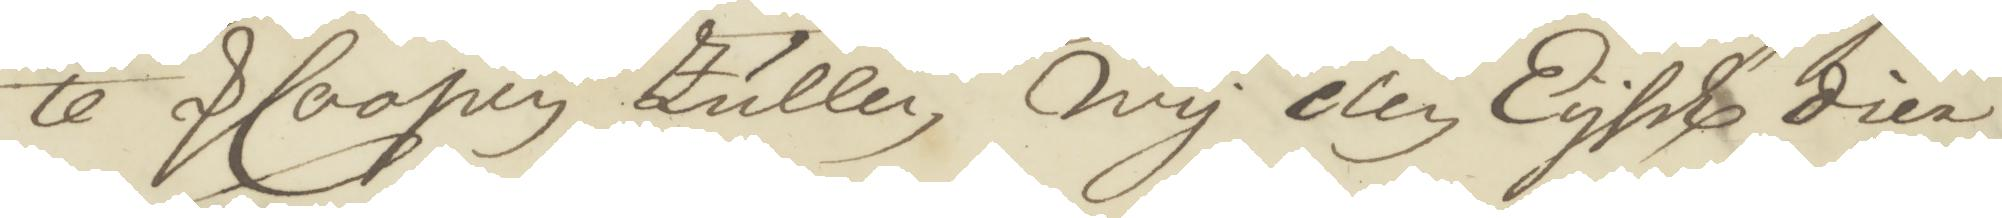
te vercoopen zullen wij den Eijsch dier
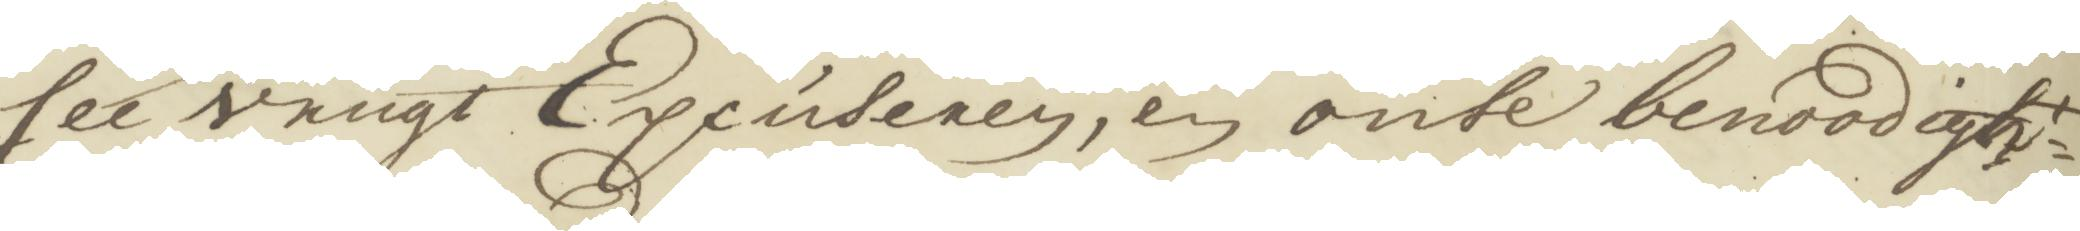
see vrugt Excuseren, en onse benoodigh=t
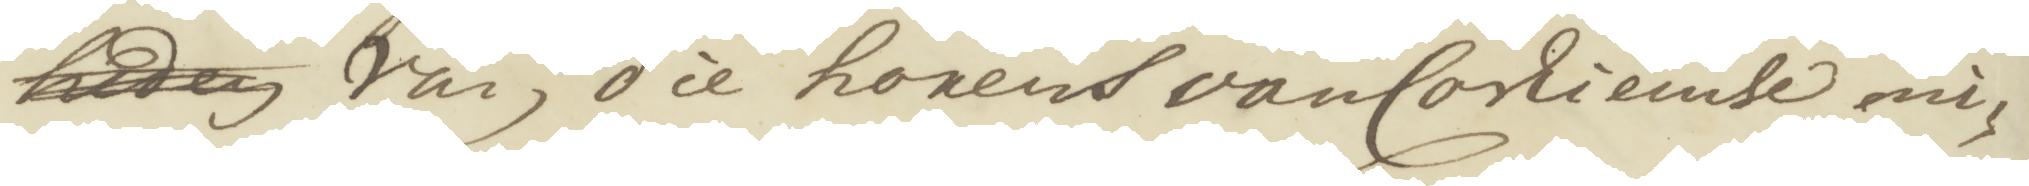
heden van die horens van Cochiemse mi„
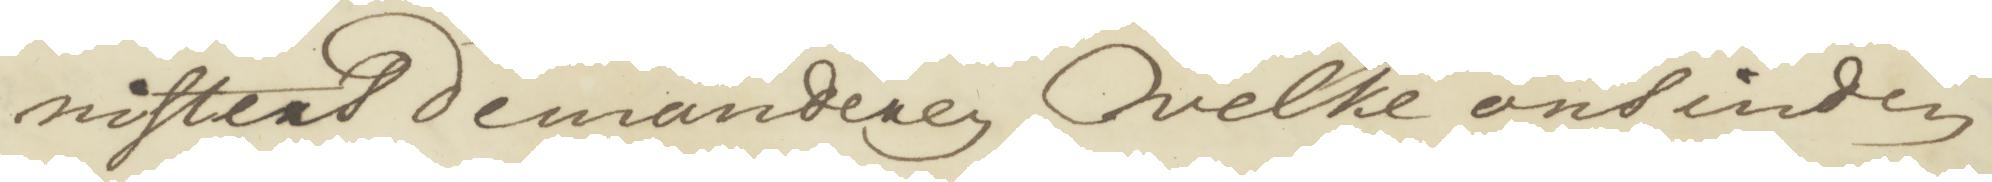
nisters demanderen, welke ons inden
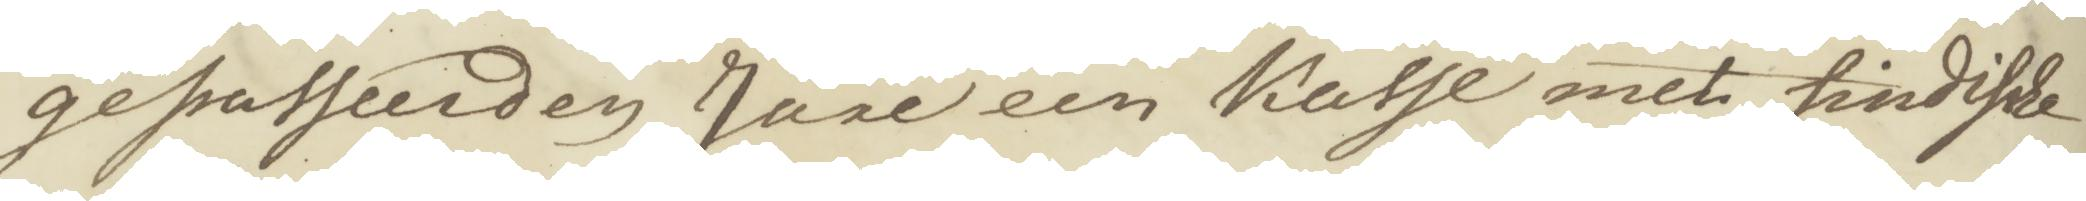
gepasseerden Jare een kasje met sindische
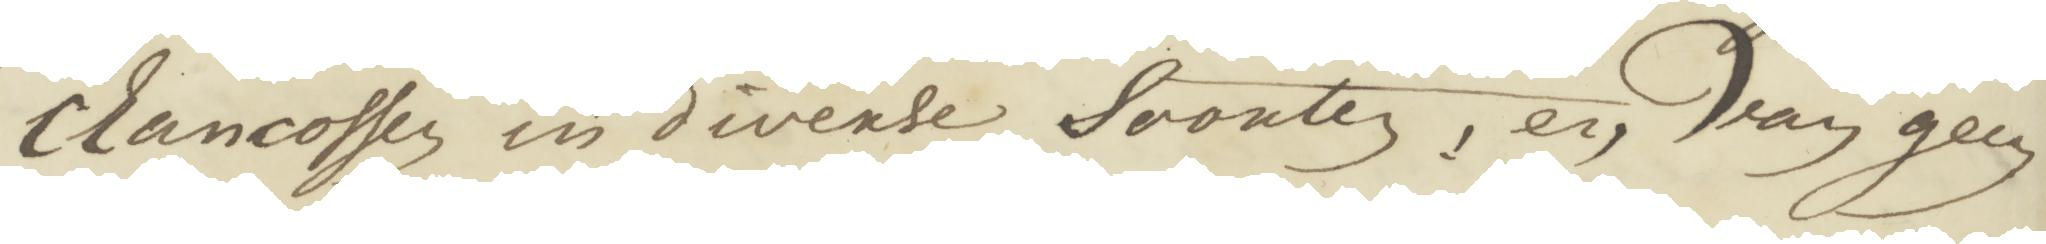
Chancossen in diverse soorten, en van geen
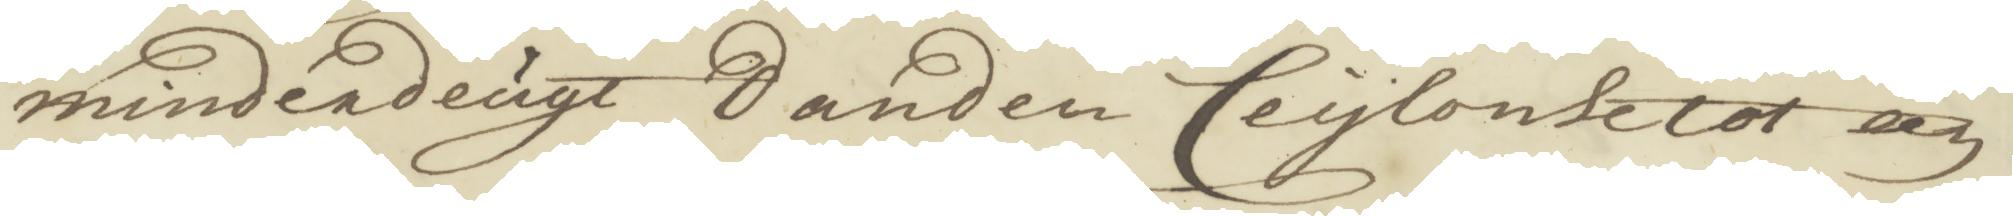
minder deugt dan den Ceijlonse tot een
